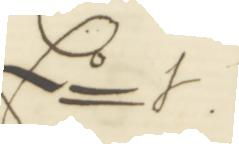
f=o 1.
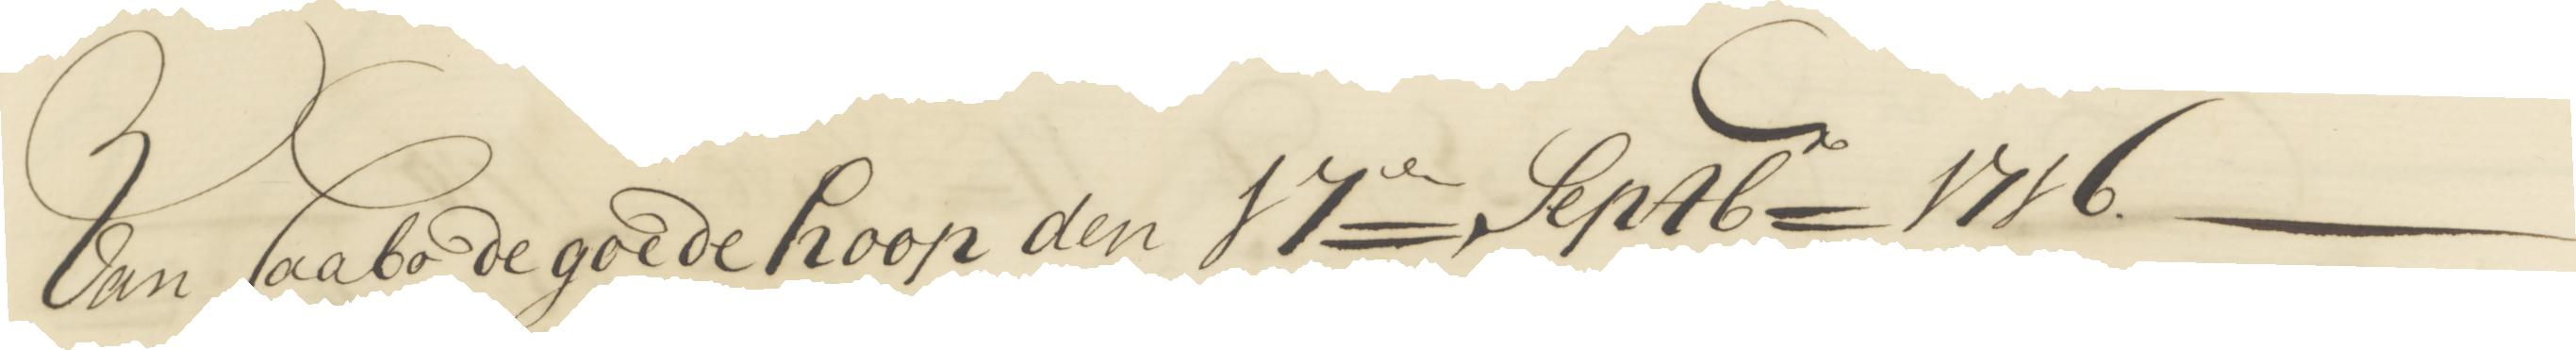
Van Caabo de goede hoop den 17=en Septb=r 1716. —
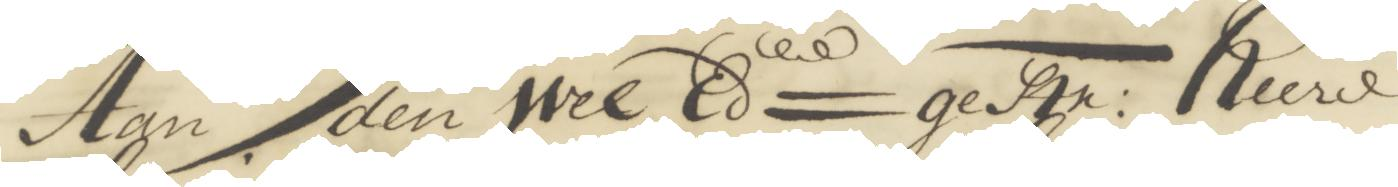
Aan den wel Ed=le gestr: heere
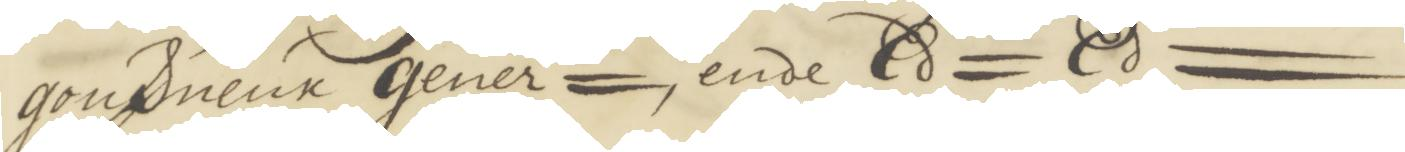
gouverneur gener=l, ende Ed=le Ed=le
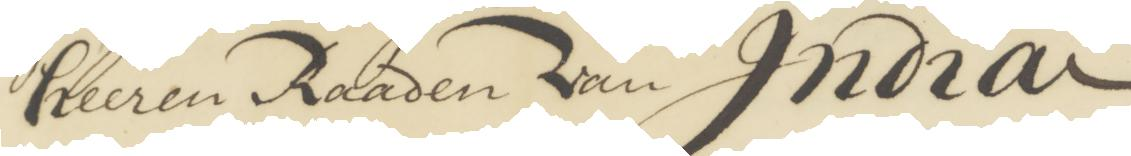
heeren Raaden van Jndia
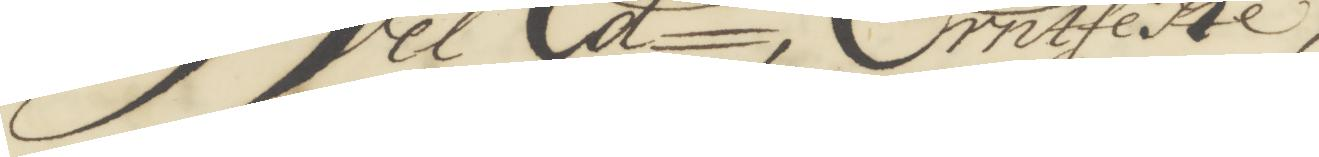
Wel Ed=le, Erntfeste,
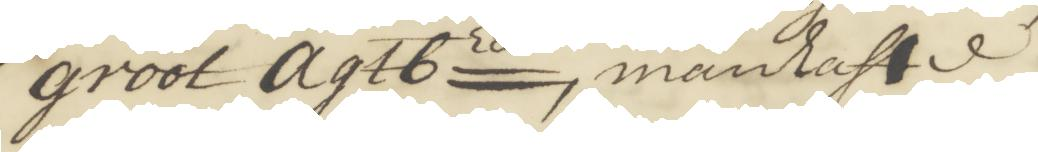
groot Agtb=re, manhafte,
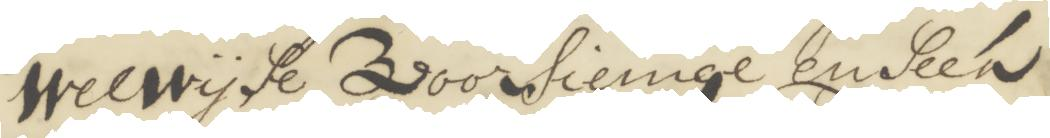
welwijse, voorsienige, en seer
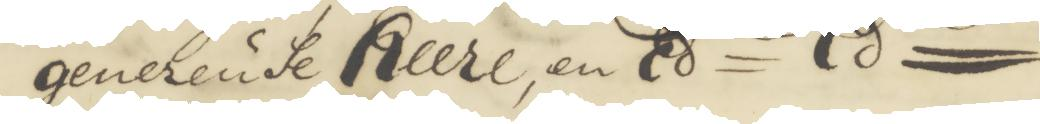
genereuse heere, en Ed=le Ed=le
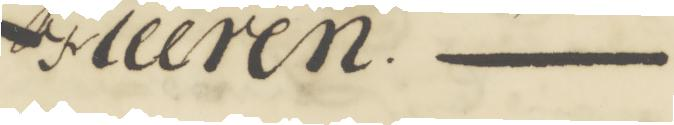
Heeren. —
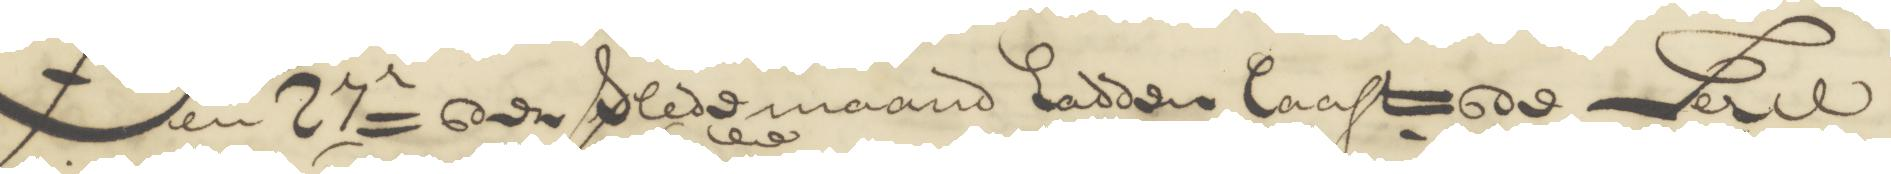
Den 27=en der verlede maand hadden laast de Eere
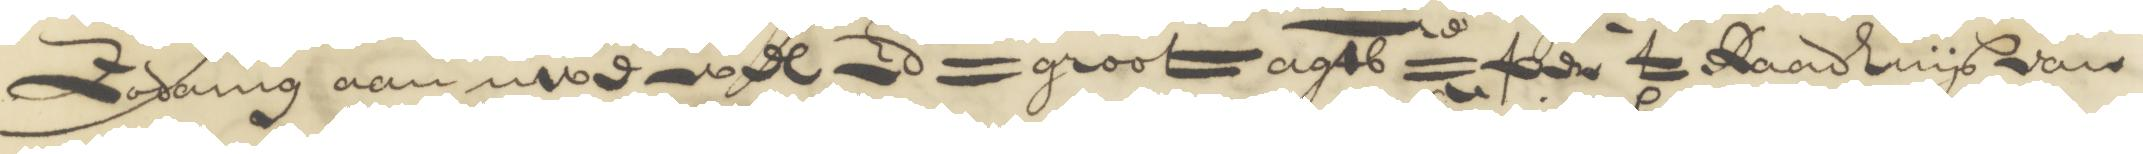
zodanig aan uwe wel Ed=le groot agtb=re per ’t Raadhuijs van
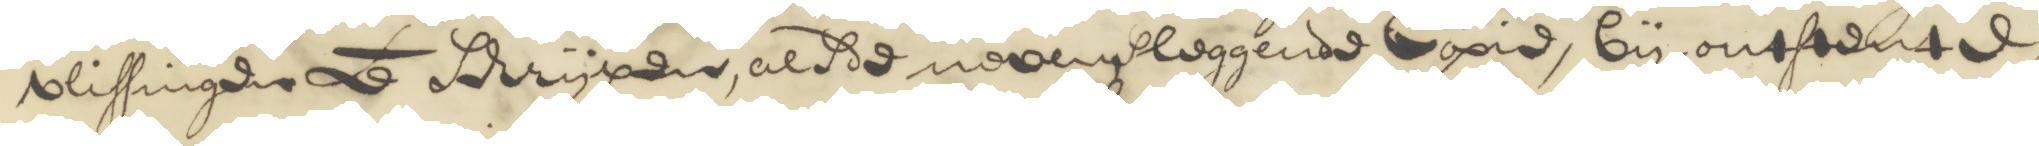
vlissingen te schrijven, als de nevensleggende Copie, bij ontstente
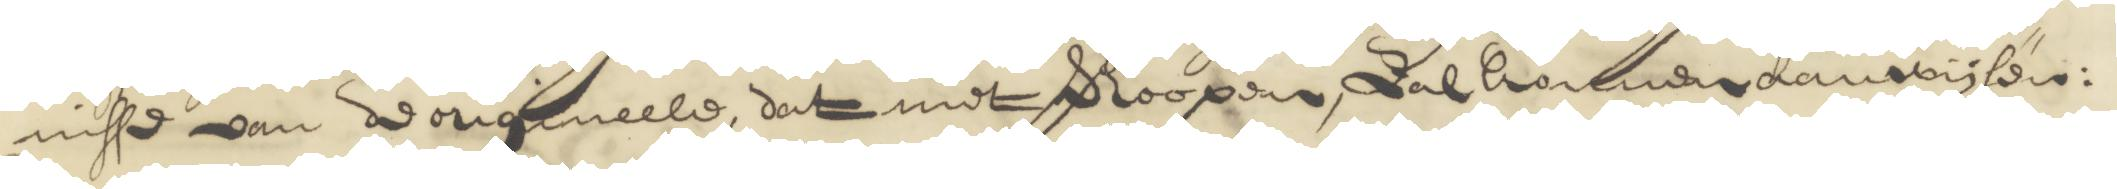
nisse van de origineele, dat niet verhoopen, zal konnen aanwijsen:
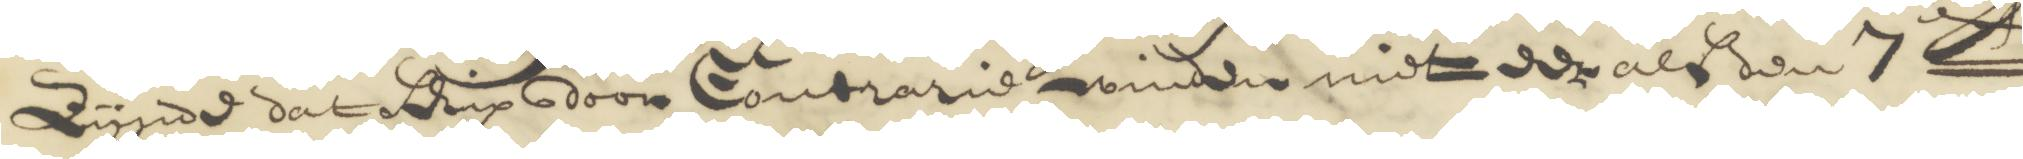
zijnde dat schip door Contrarie winden niet eer als den 7=en
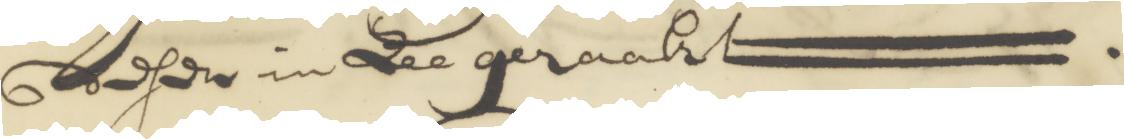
deser in zee geraakt.
